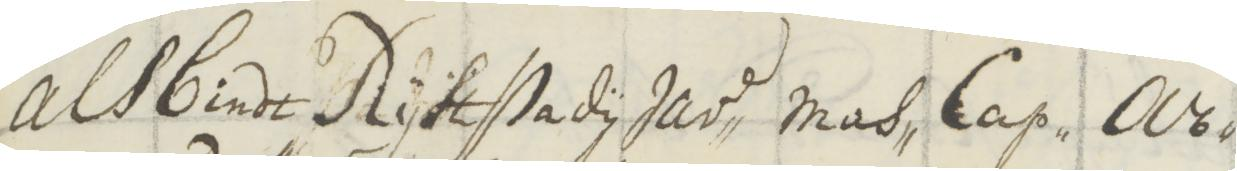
als bindt Rijst padij Jav„e mas„ Cap„ Ar„
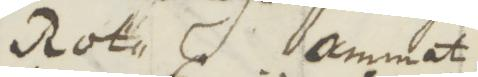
Rot„ ammat
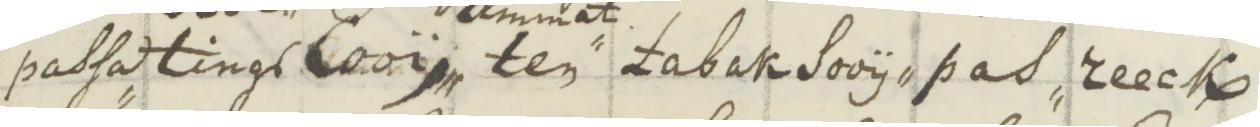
passa„ tings Cooij„ ten tabak sooij„ pas„ reeck
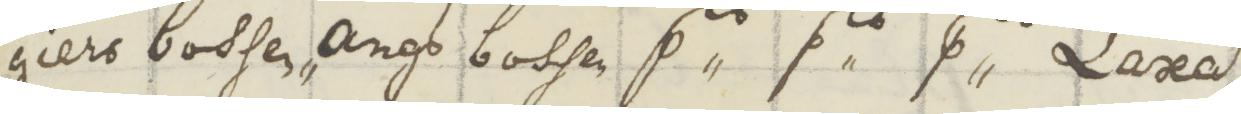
giers bossen„ angs bossen p„ls p„ls p„ls Laxa
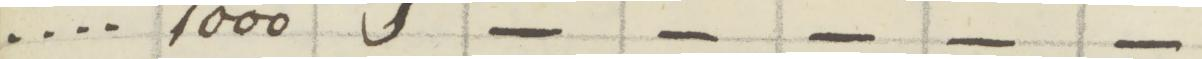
. . . . 1000 1 — — — — —
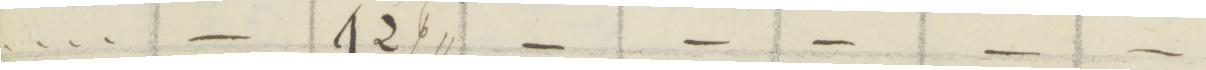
. . . . — 42 p„ls — — — — —
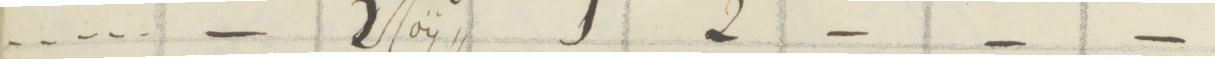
. . . . . — 2 Coij„s 1 2 — — —
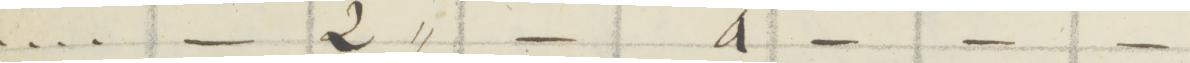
. . . . — 2 „ — 4 — — —
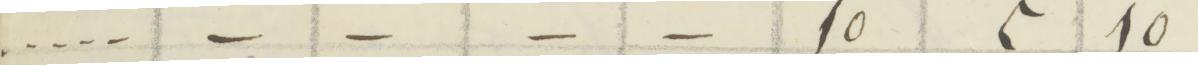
. . . . . — — — — 10 5 10
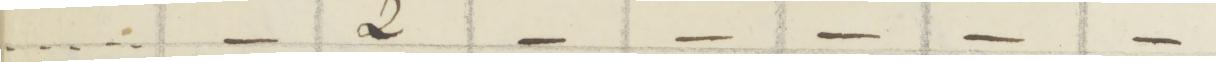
. . . . . — 2 — — — — —
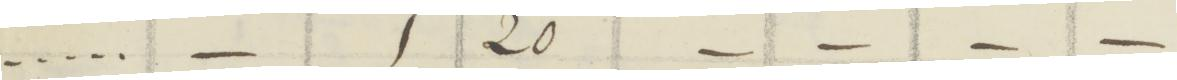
. . . . . — 1 20 — — — —
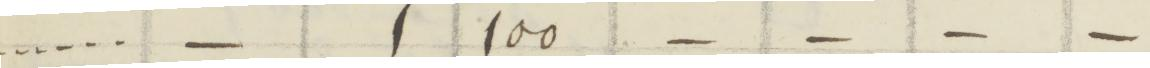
. . . . . . — 1 100 — — — —
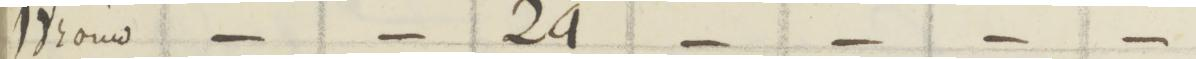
1 Vrouw — — 24 — — — —
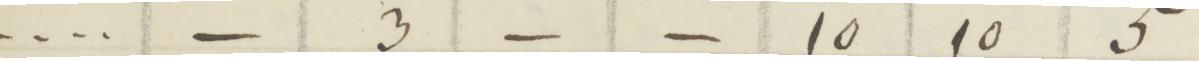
. . . . — 3 — — 10 10 5
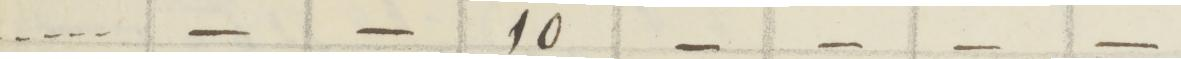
. . . . . — — 10 — — — —
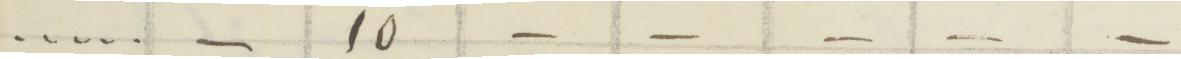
. . . . . — 10 — — — — —
